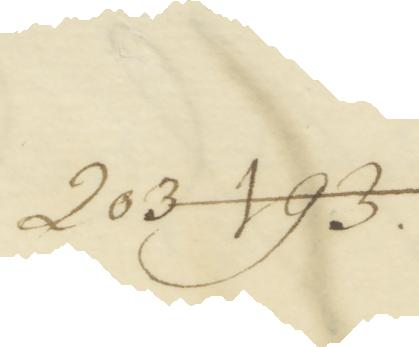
203 193.
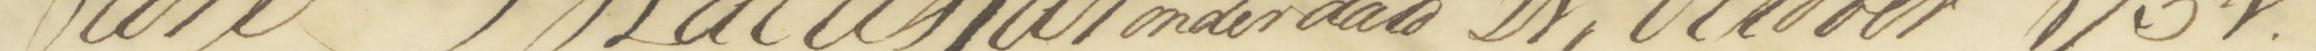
Van Macassar onderdato 21„~ october 1751.
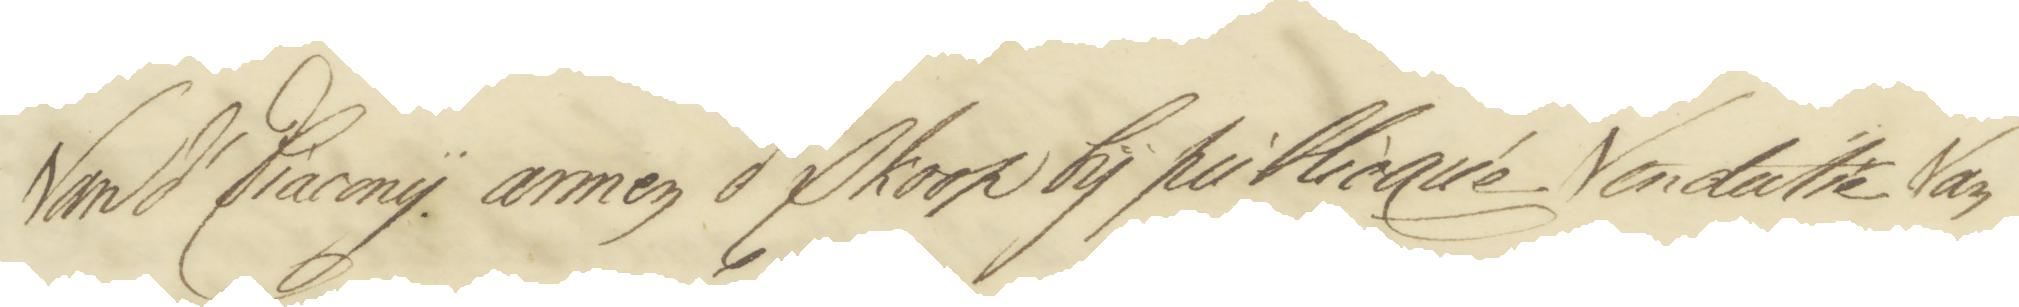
Van d’ Diaconij armen d' verkoop bij publicque vendatie van
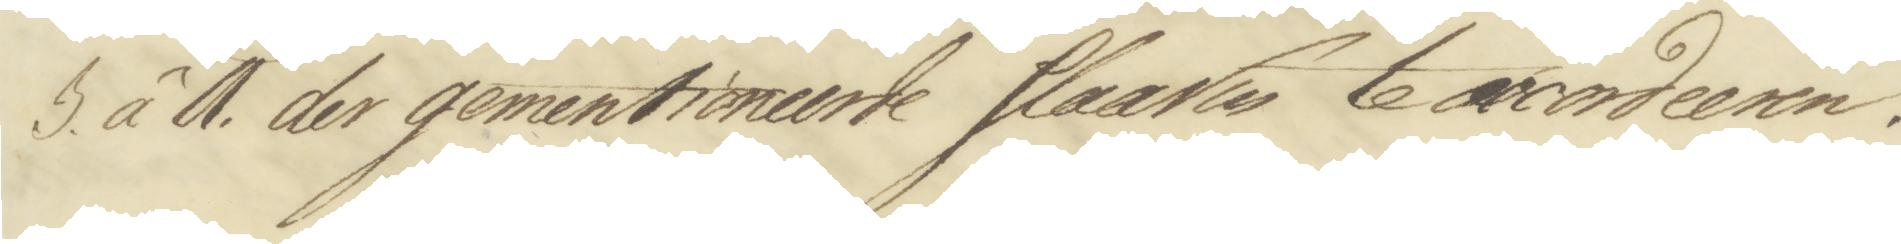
3. â 4. der gementioneerde slaaven te accordeeren.
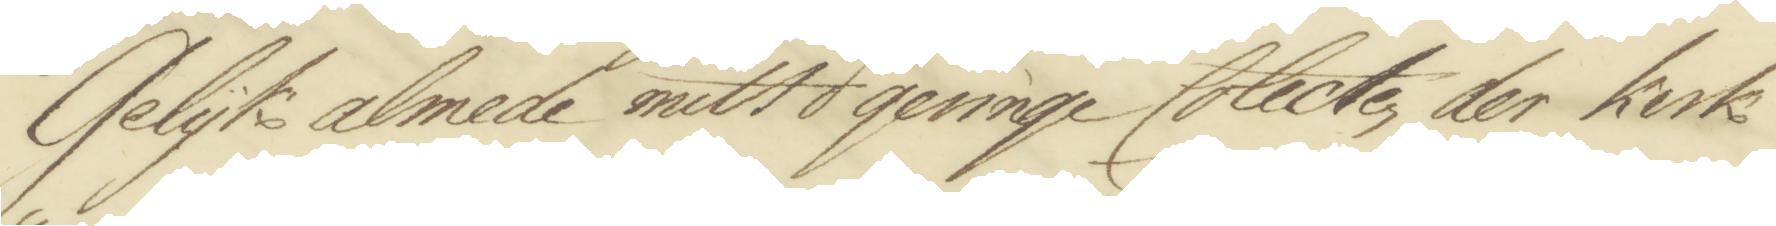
Gelijk almede mits d' geringe Colecten der kerk
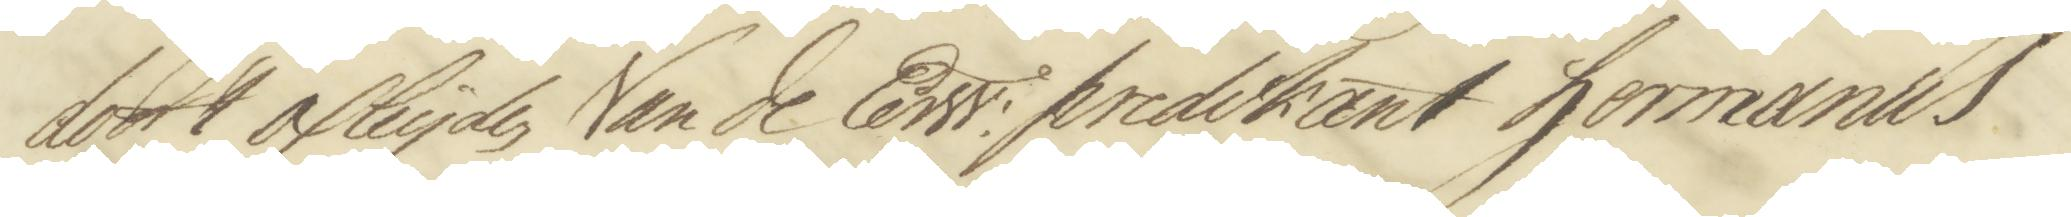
door ’t overleijden van de Eerw: predikant Hermanus
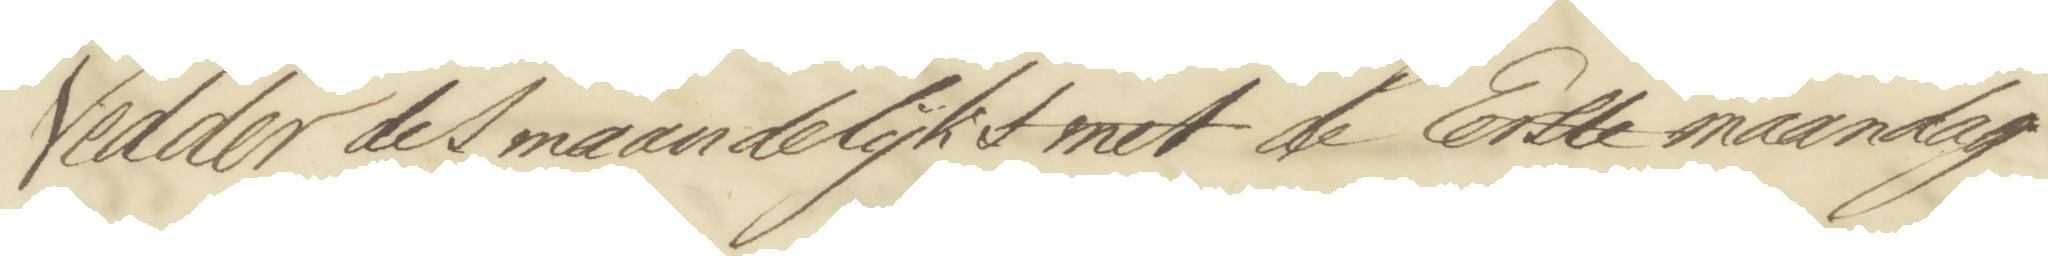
Vedder des maandelijks met de Eerste maandag
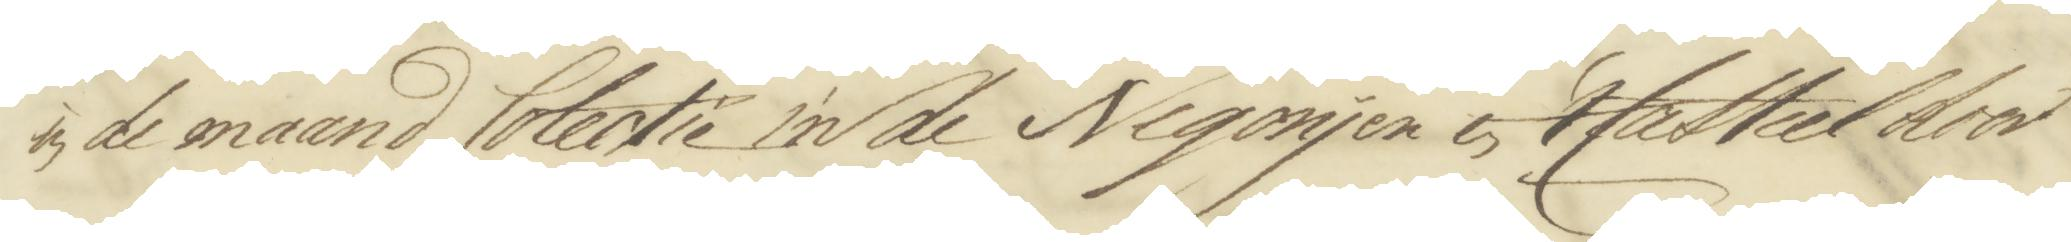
in de maand Colectie in de Negorijen in ’t Casteel door
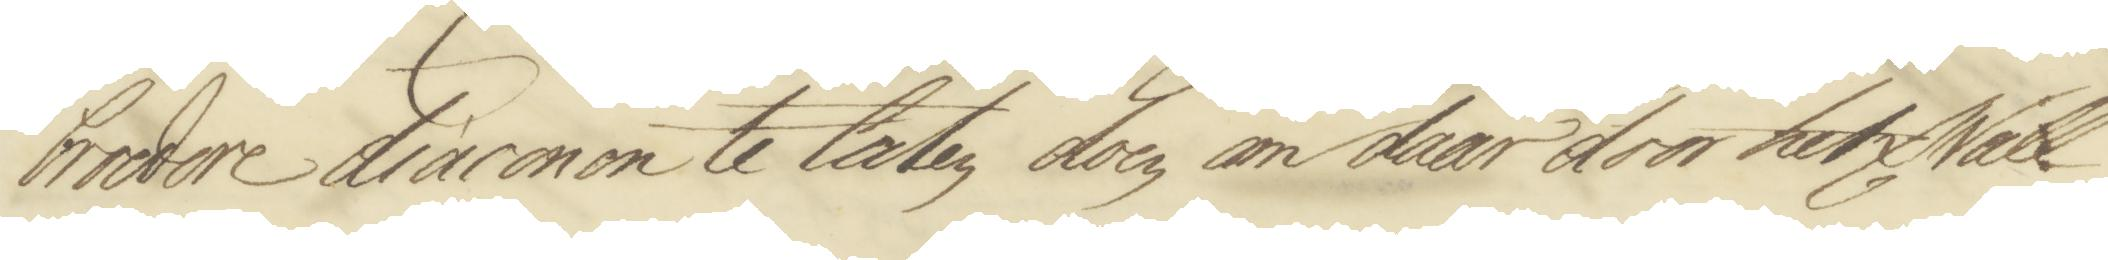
broedere diaconen te laten doen om daar door het vervall
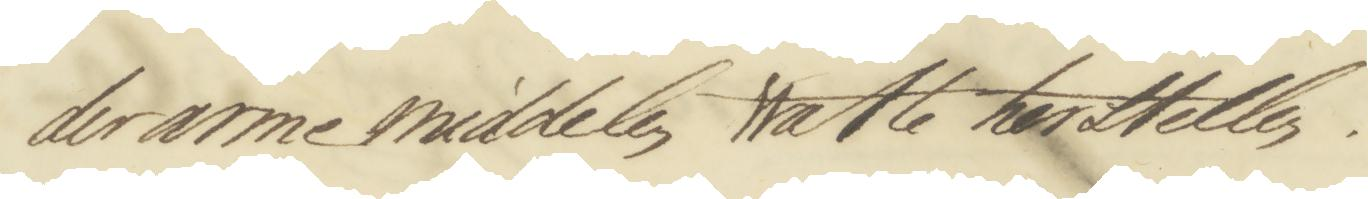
der arme middelen wat te herstellen.
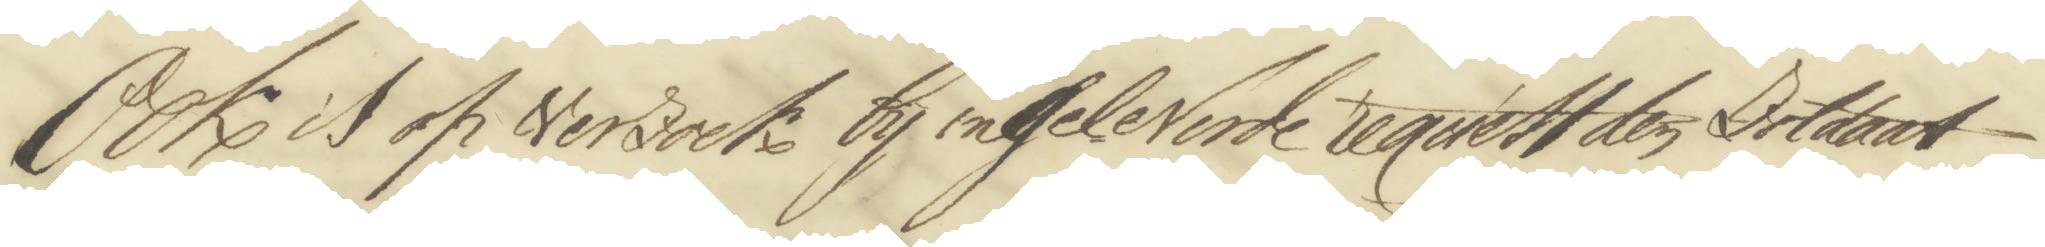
Ook is op verzoek by ingeleverde request den zoldaat
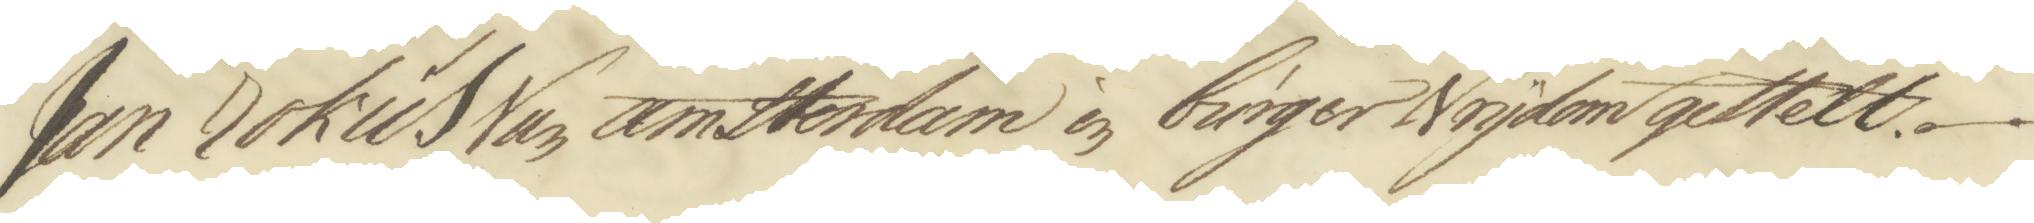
Jan rokus Van Amsterdam in burger vrijdom gestelt. —
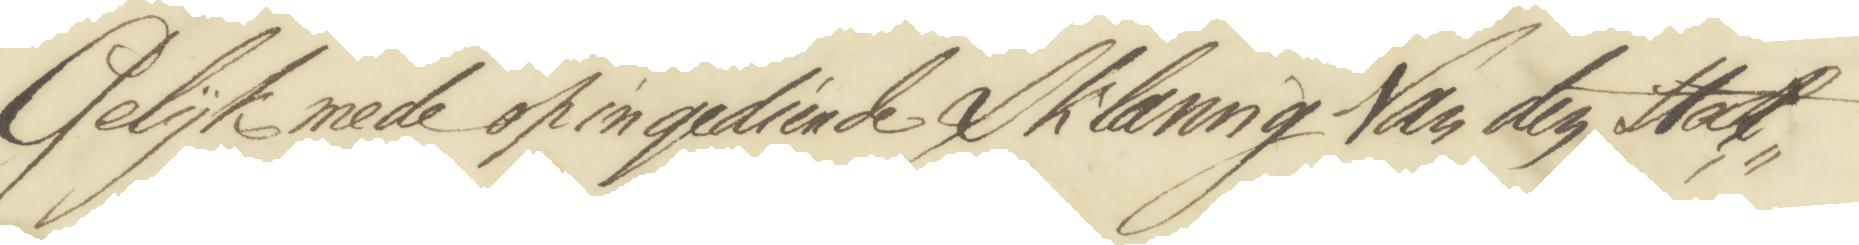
Gelijk mede op ingediende verklaring van den stal„
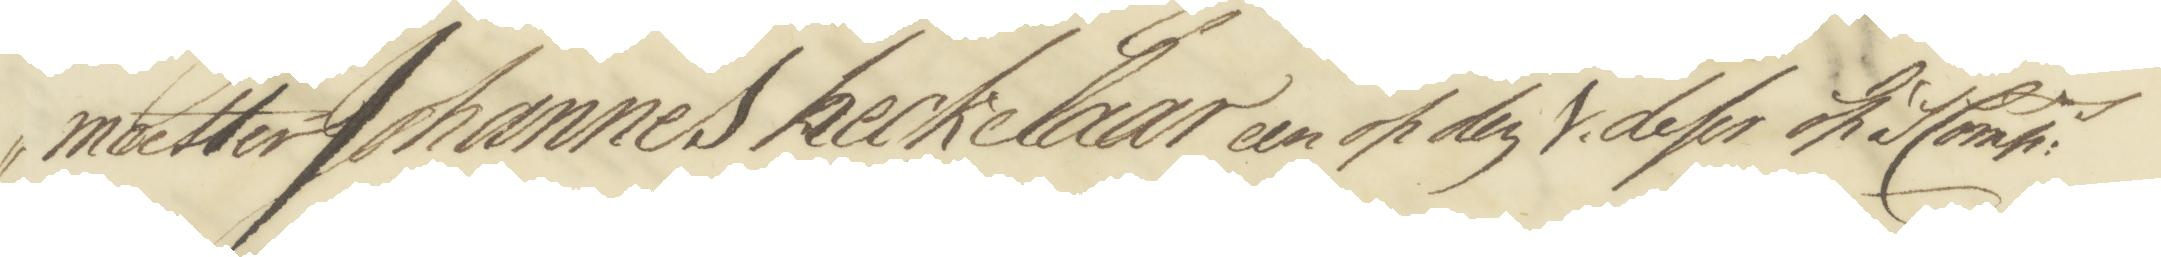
„meester Johannes heckelaar een op den 1. deser op 's Comp:s
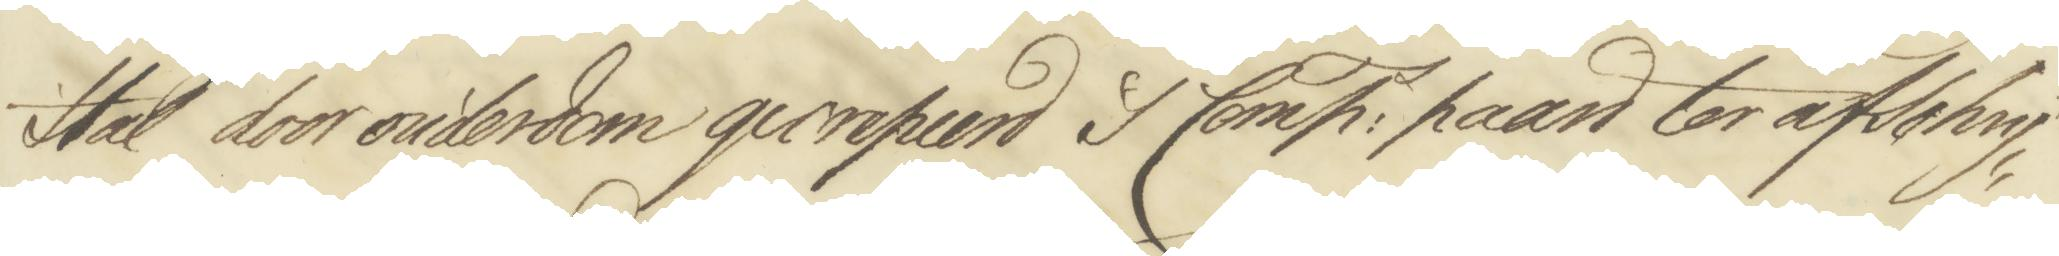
stal door ouderdom gecrepeerd ’s Comp:s paard ter afschrij„
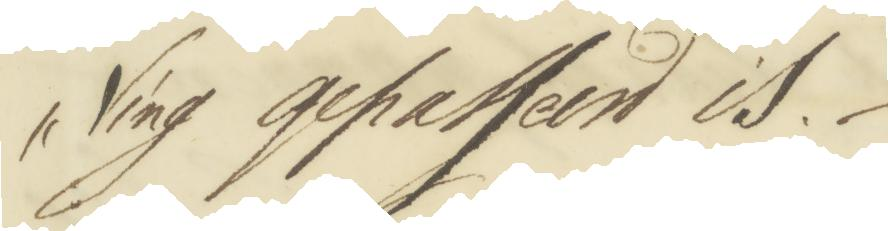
„ving gepasseerd is.
